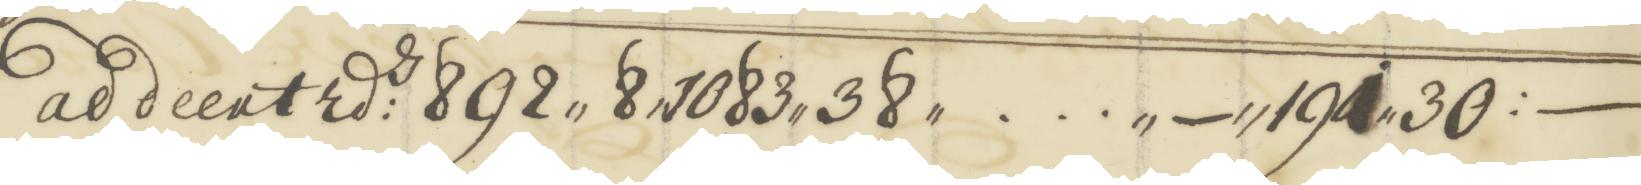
addeert rd:s 892„ 8„1083„38„ . . . „—„194„30:—
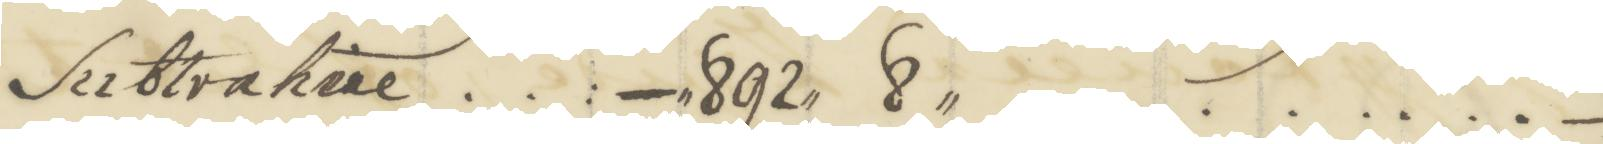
subtrahere . . . : —„892„ 8 „ . . . . . . . . —
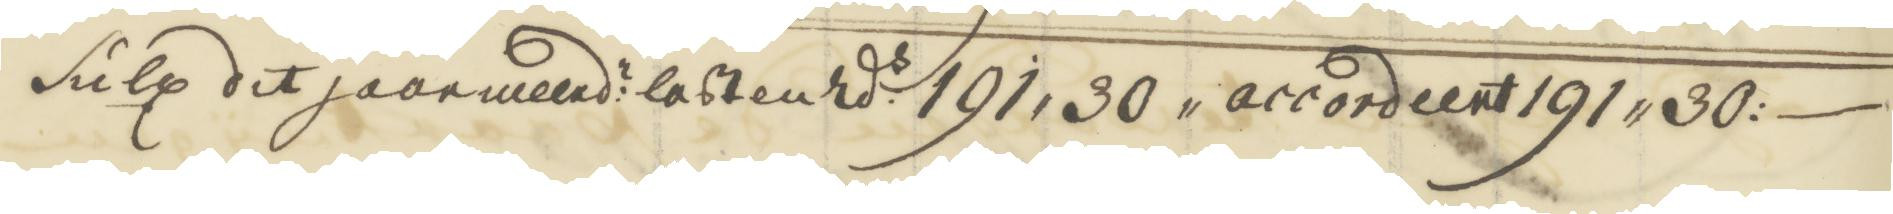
sulx dit jaar meerd:r lasten rd:s 191„30 „ accordeert 191„30: —
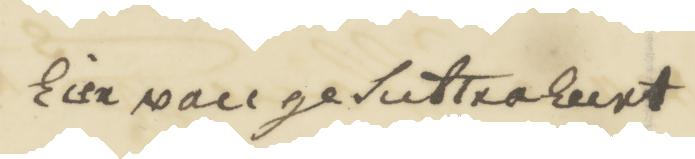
hier van gesubtraheert
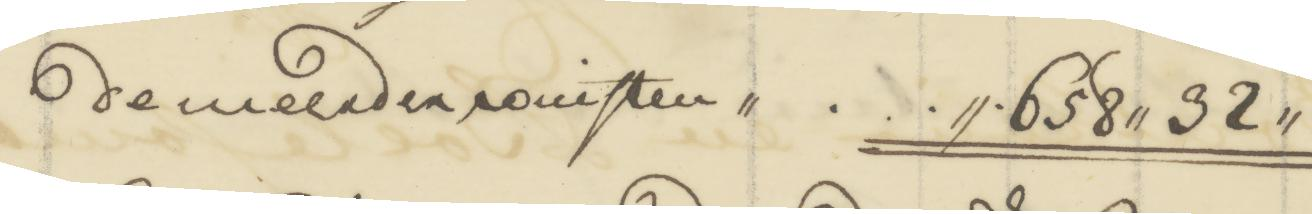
de meerder winsten „ . . . „ . 658„ 32 „
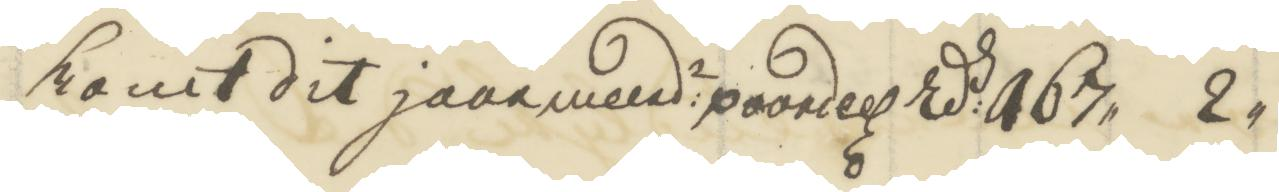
komt dit jaar meerd:r voordeelen rd:s 467„ 2„
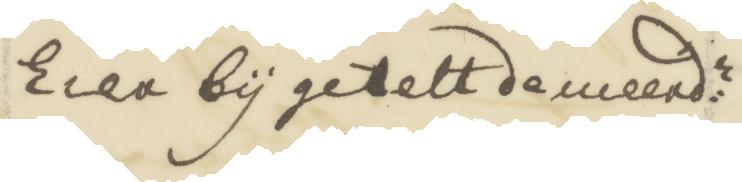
hier bij getelt de meerd:r
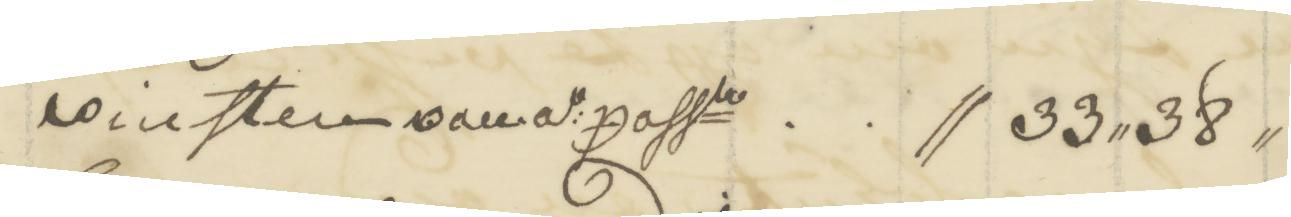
winsten van a:o pass=to . . „ 33„38 „
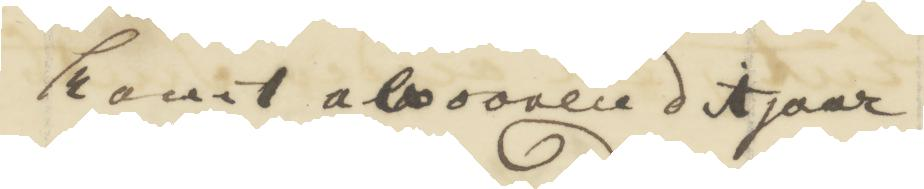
komt alvooren dit jaar
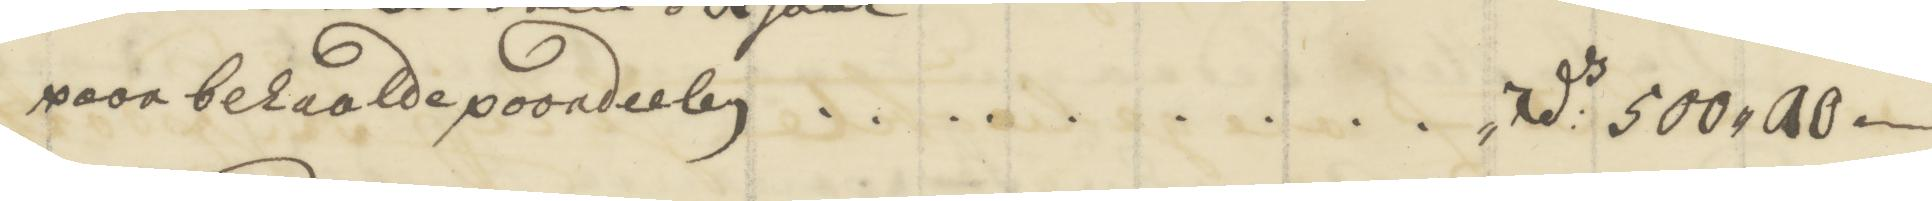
voor behaalde voordeelen . . . . . . . . . „ rd:s 500„40 —
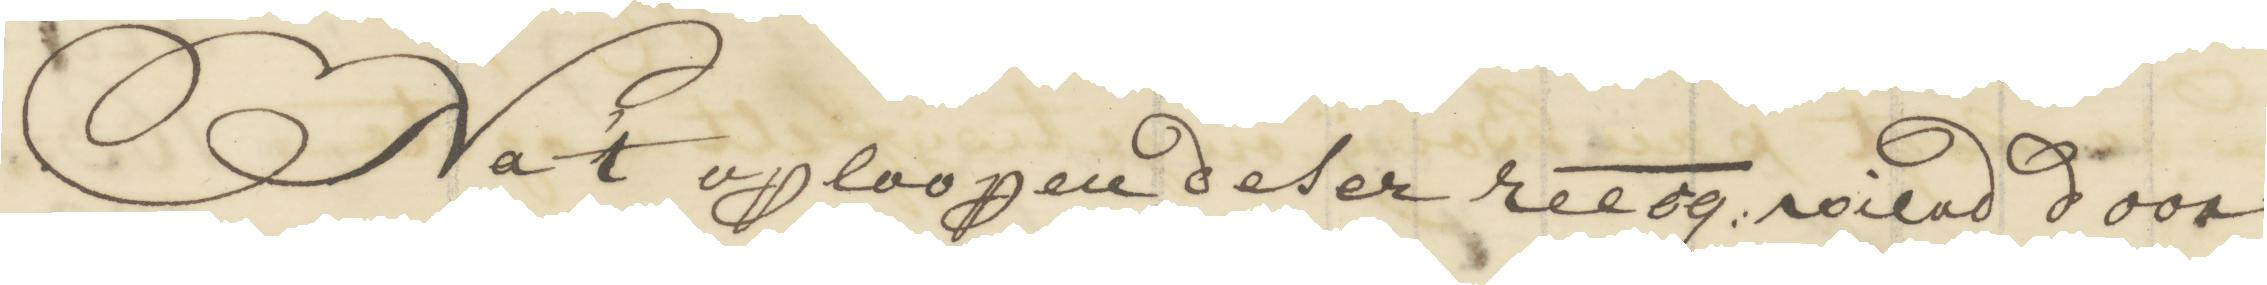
Na ’t oploopen deser reecq: wierd door
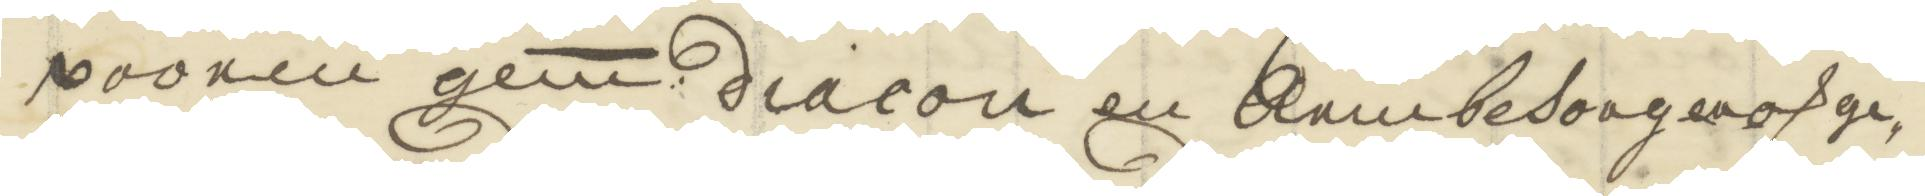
vooren gem: diacon en Armbesorger overge„
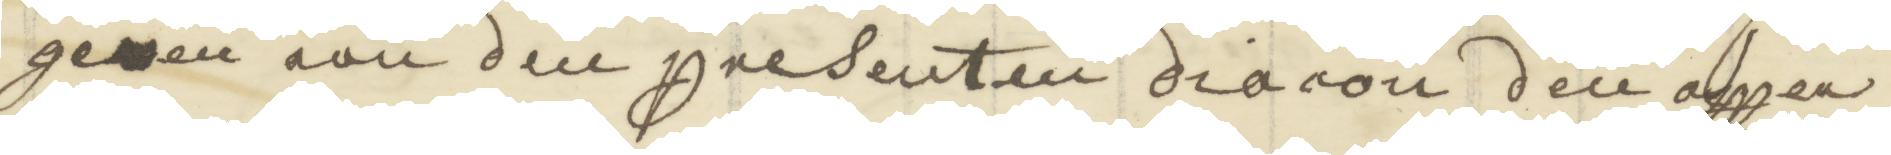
geven aan den presenten diacon den opper
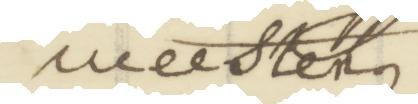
meester
